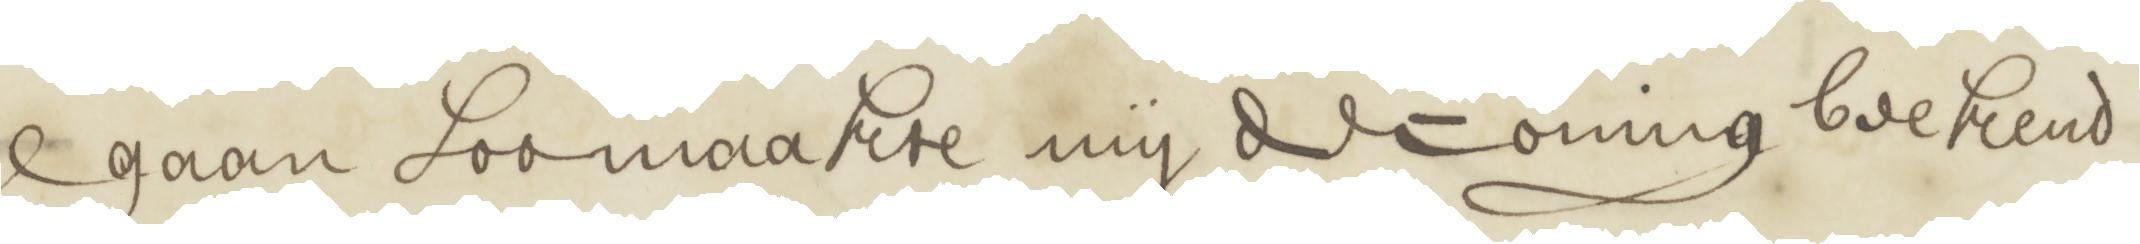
gaan Soo maakte mij de Coning beekend
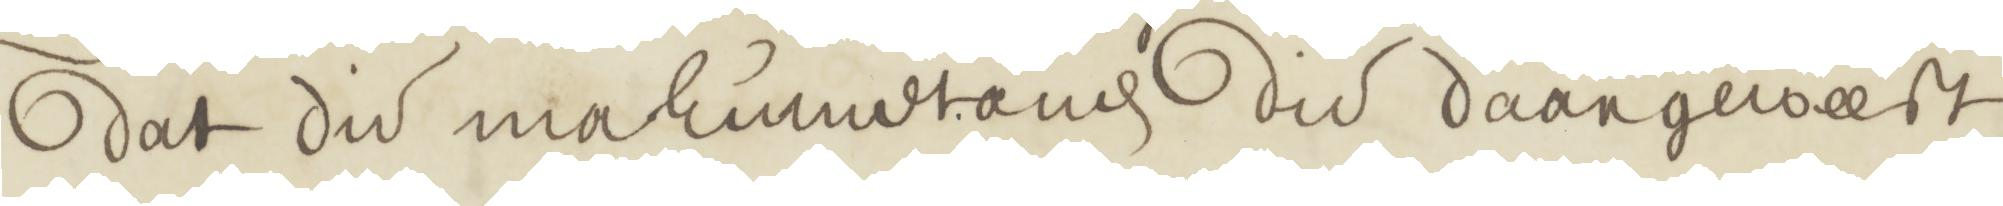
dat die mahumetanen die daar geweest
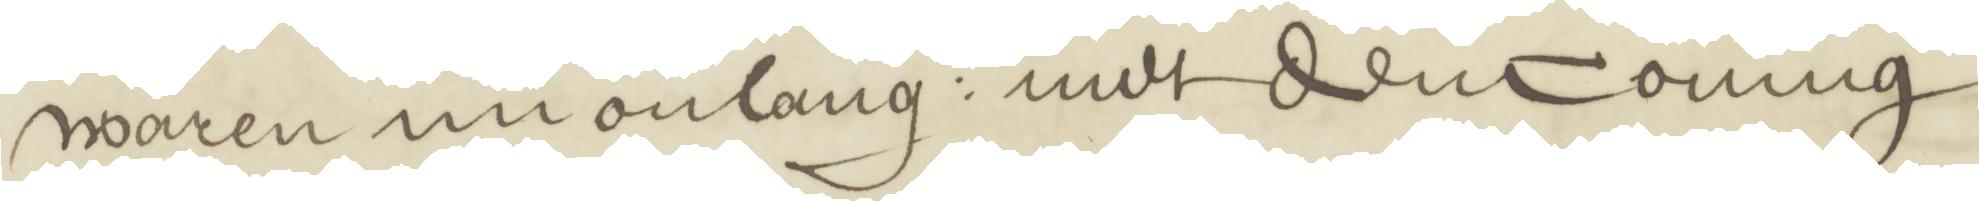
waren nu onlang: met den Coning
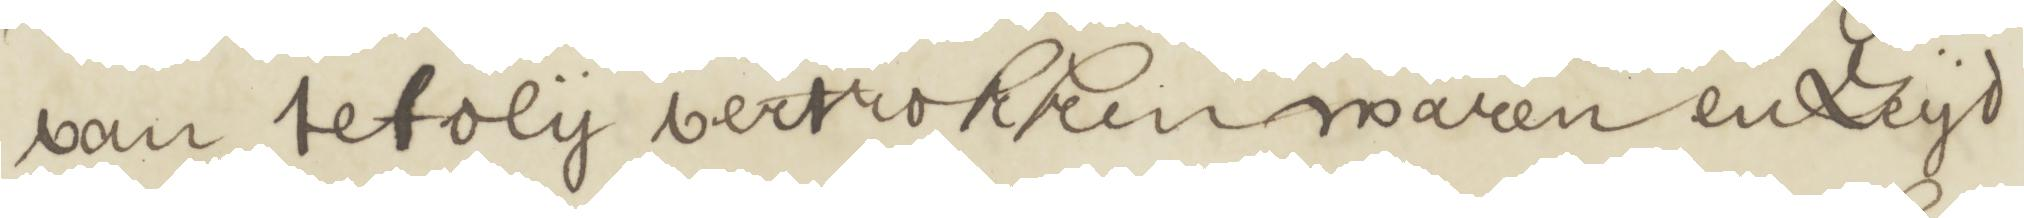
van tetolij vertrokken waren en Zeijd
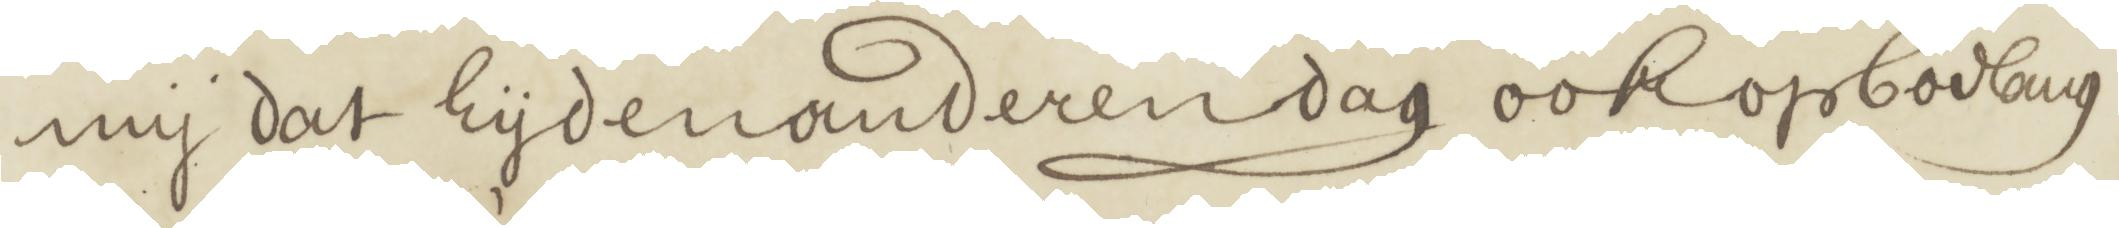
mij dat hij den anderen dag ook op boelang
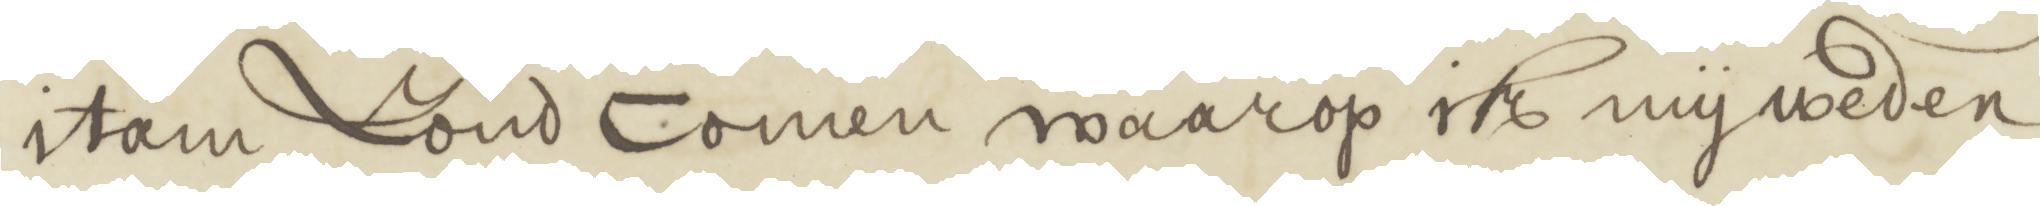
itam Zoud comen waarop ik mij weder
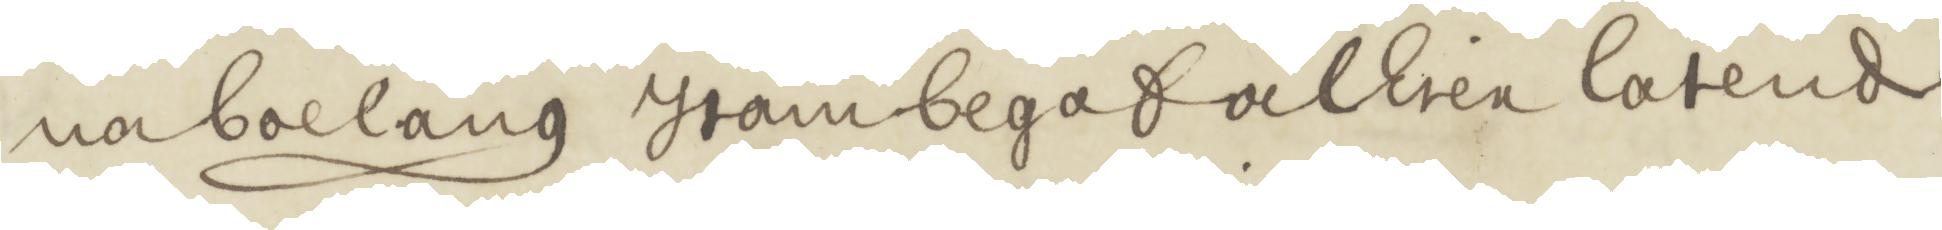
na boelang Itam begaf alhier latende
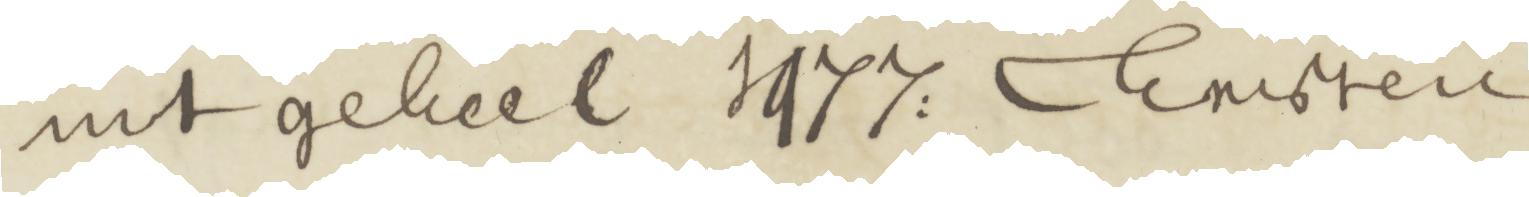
in 't geheel 1477: Christen
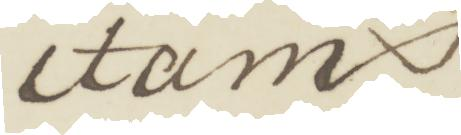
itam
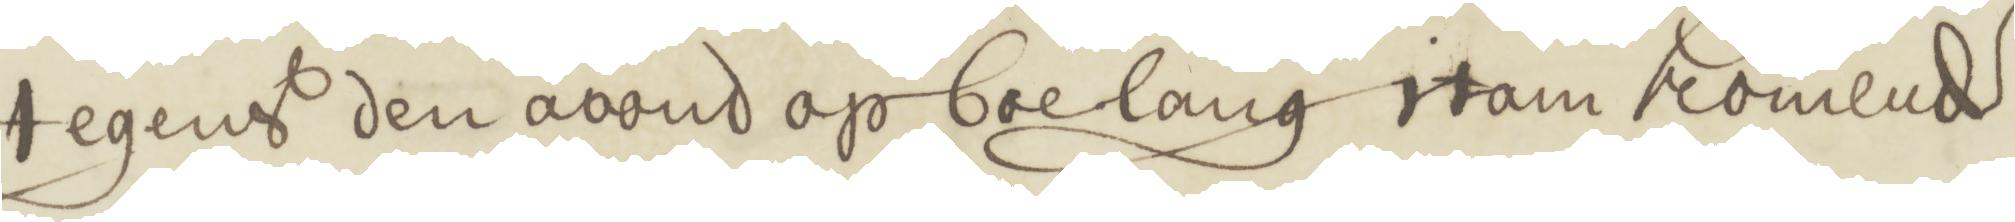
tegens den avond op boelang itam komende
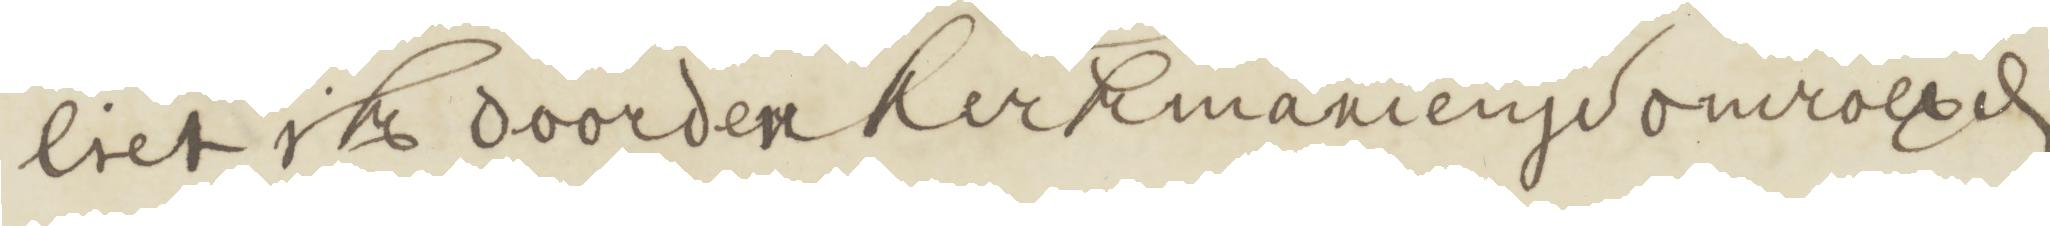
liet ik door der kerk marienje om roepen
